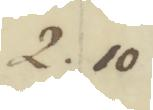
2. 10
